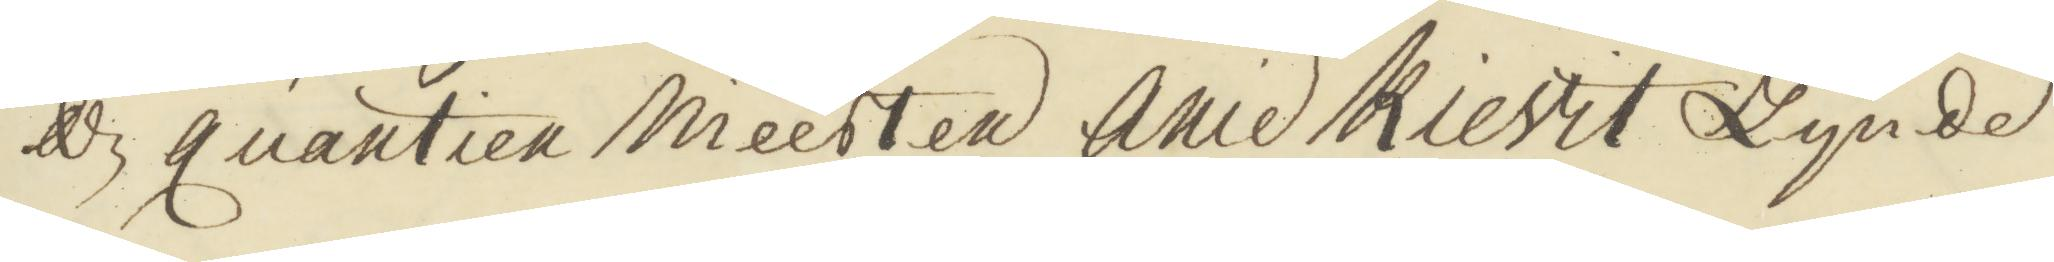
den quartier meester arie Kievit zijnde
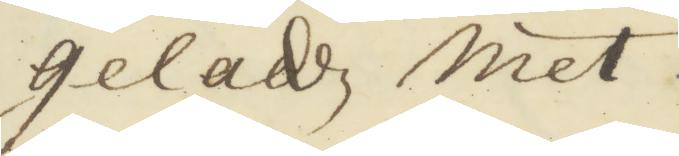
geladen met
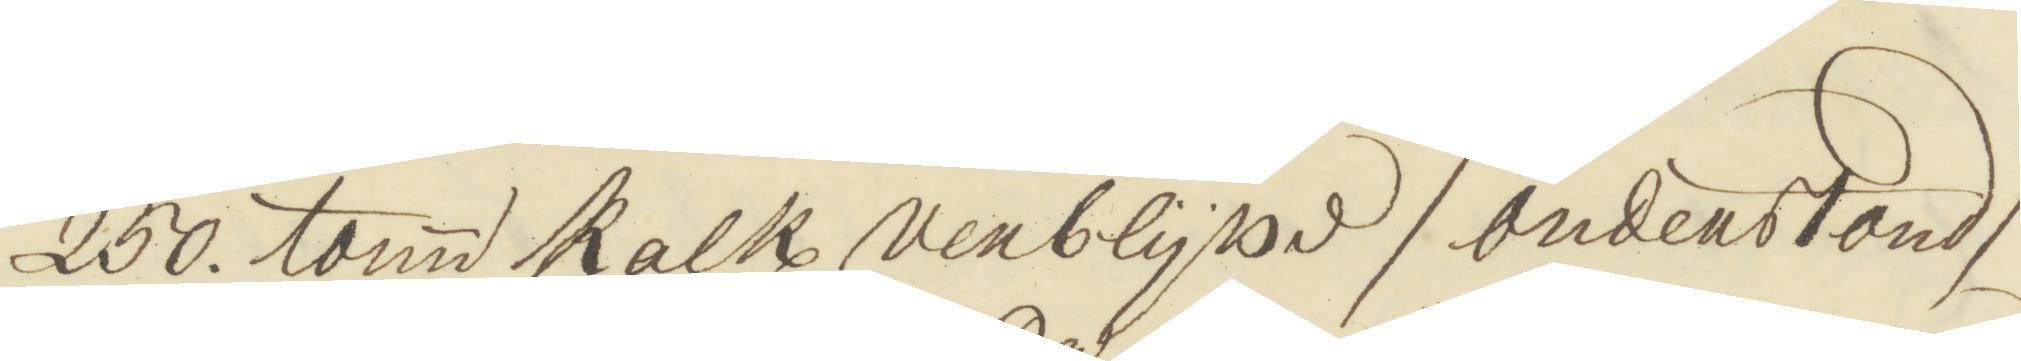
250. tonn Kalk verblijve / onderstond/
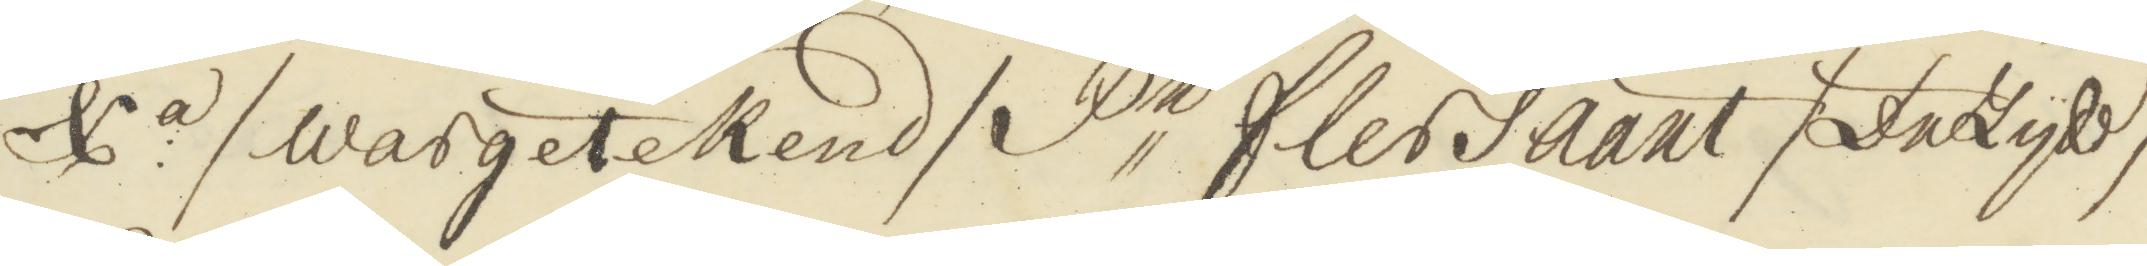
&:a /:was getekend/ P„r flessaart / terzijde,
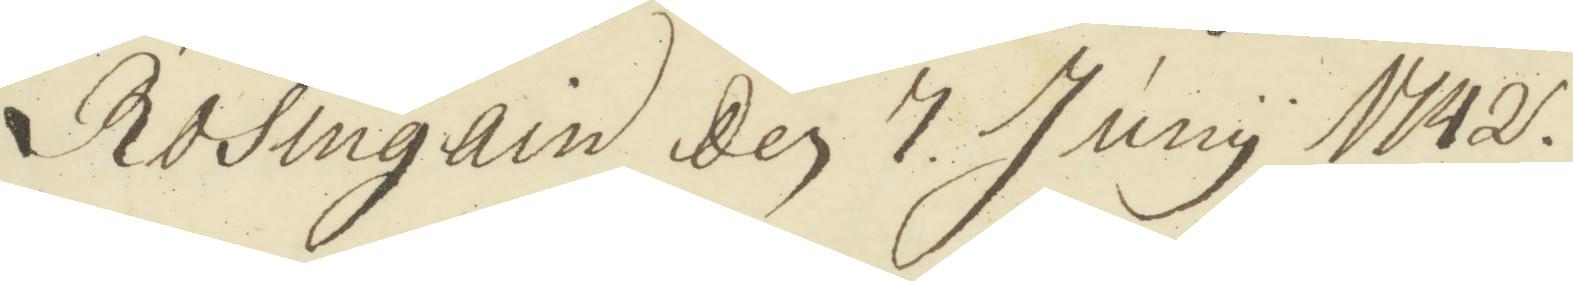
Rosingain den 7: Junij 1742.
